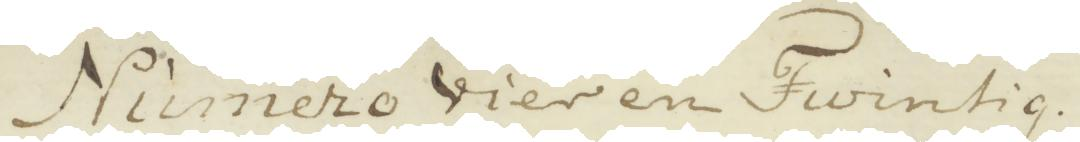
Numero vier en Twintig
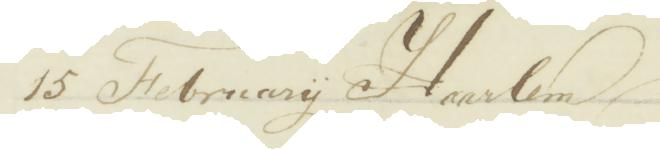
15 Februarij Haarlem
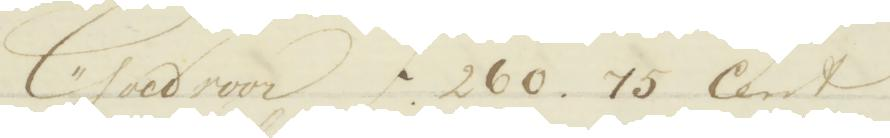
Goed voor ƒ. 260. 75 Cent
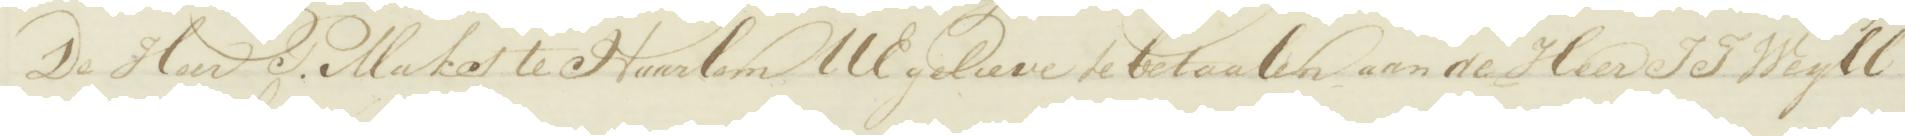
De Heer P. Maks te Haarlem UE gelieve te betaalen aan de Heer I.F. Weyll
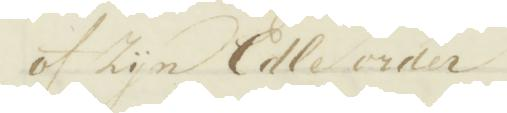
of zijn Edle order
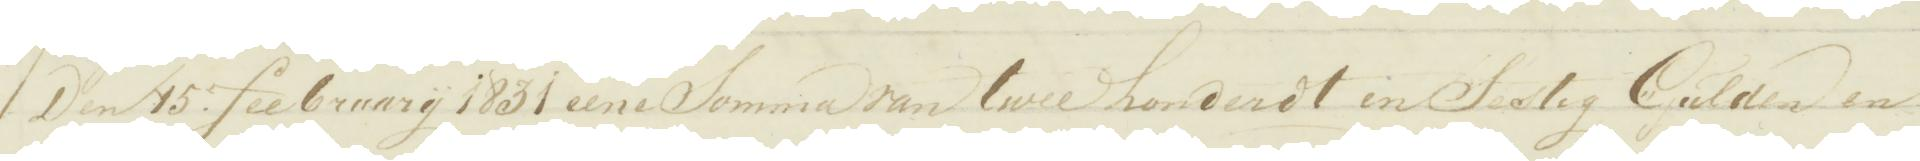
Den 15. feebruarij 1831 eene Somma van twee honderdt en Sestig Gulden en
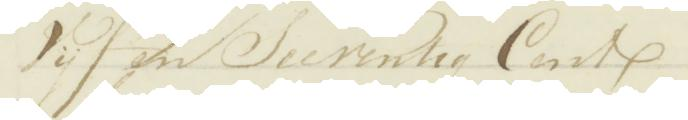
Vijf en Seeventig Cents
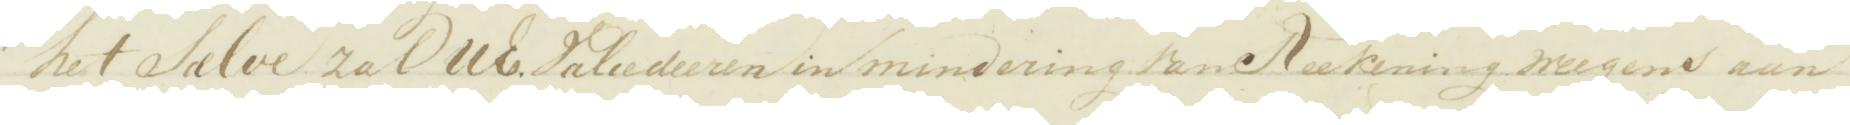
het Selve zal UE. Valiedeeren in mindering van Reekening weegens aan
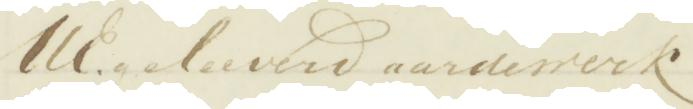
UE geleeverd aardewerk
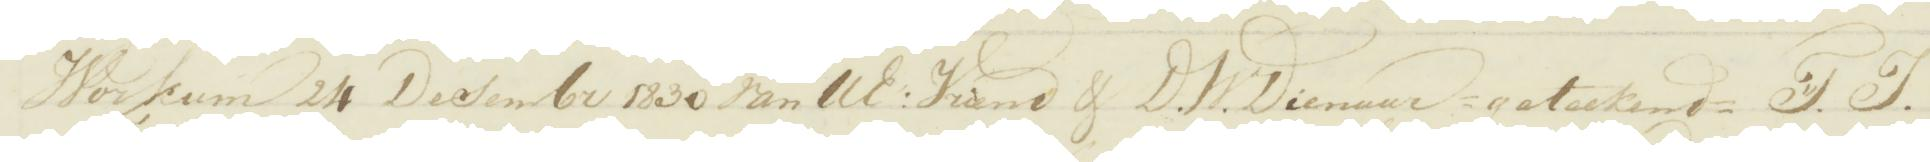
Workum 24 Desembr 1830 van UE: Vriend & D.W. Dienaar = geteekend= F. I.
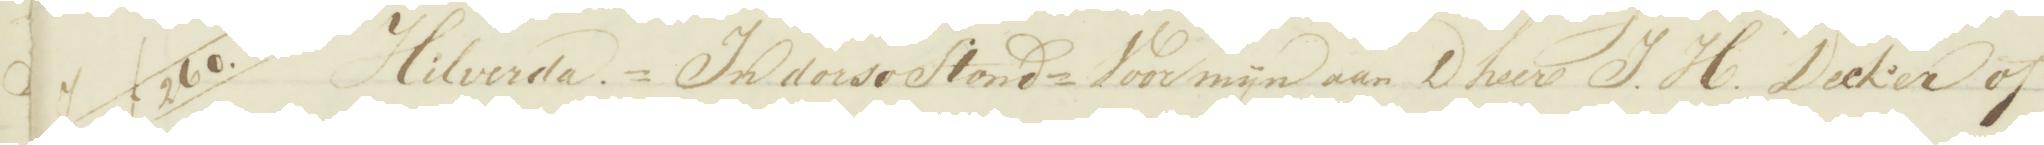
Zegge ƒ 260. 75. Hilverda. = Indorso stond= Voor mijn aan D heer I. H. Deeker of
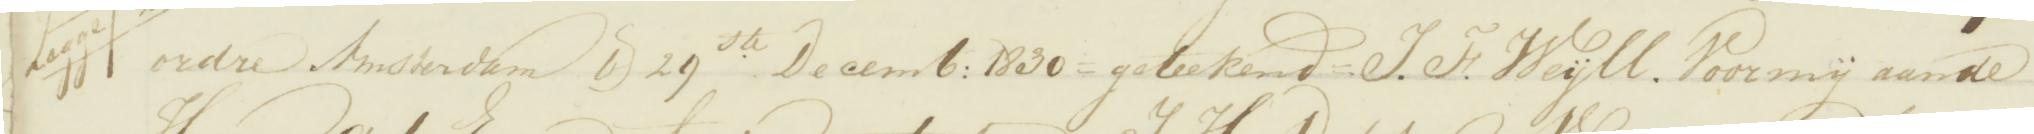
ordre Amsterdam den 29.ste Decemb: 1830 =geteekend= I. F: Weijll. Voor mij aan de
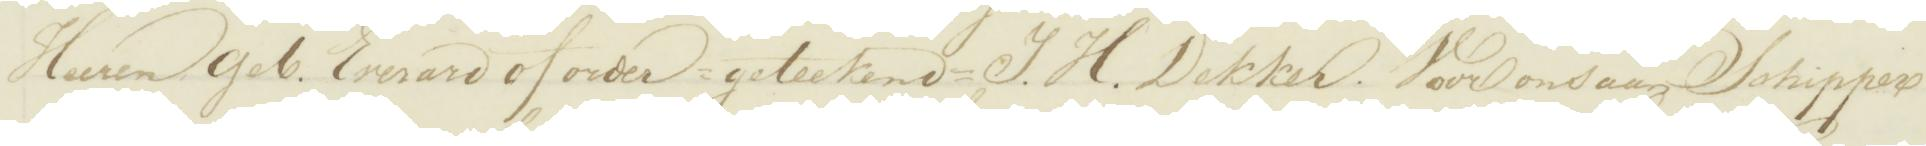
Heeren geb. Everard of order =geteekend= I. H. Dekker. Voor ons aan Schipper
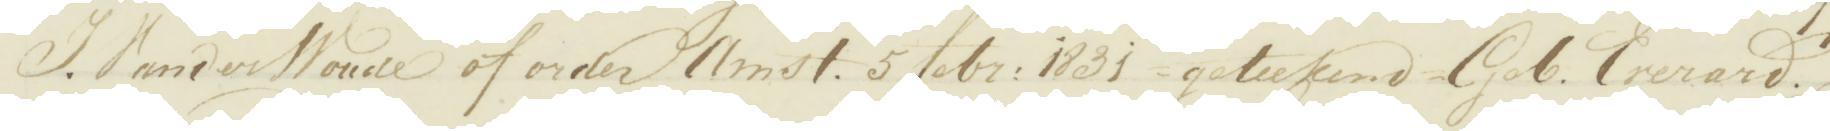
I. van der Woude of order Amst. 5 febr: 1831 = geteekend. Geb. Everard.
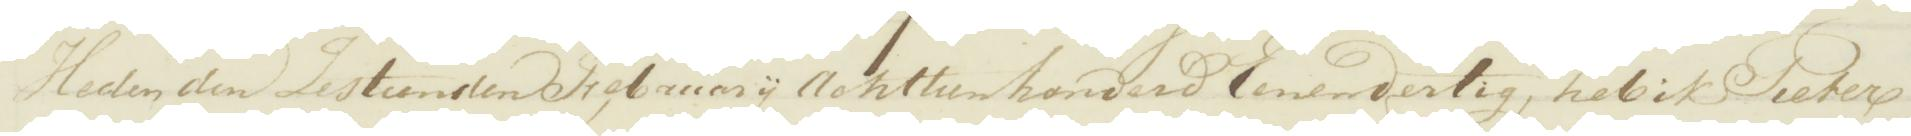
Heden den Zestienden Februarij Achttienhonderd Eenendertig, heb ik Pieter
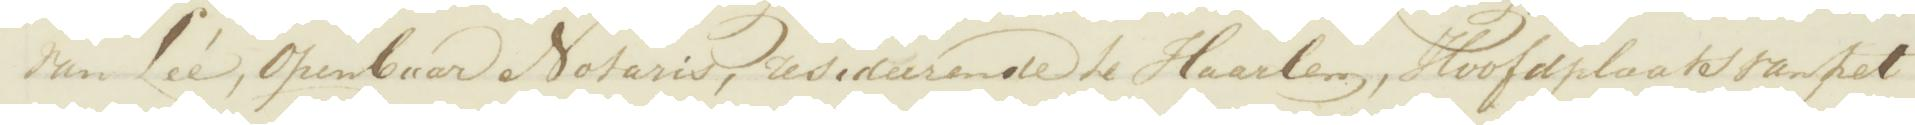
van Lee, Openbaar Notaris resideerende te Haarlem, Hoofdplaats van het
